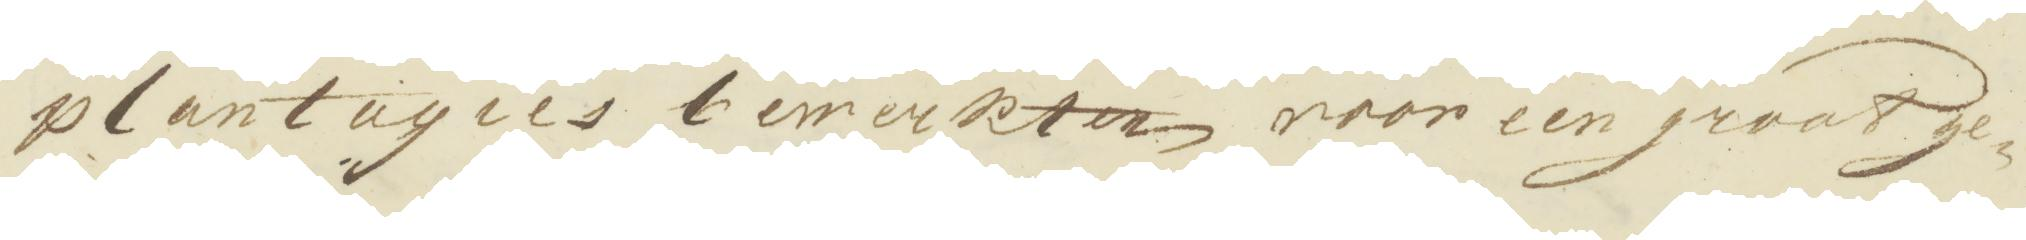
plantagies bewerkten voor een groot ge„
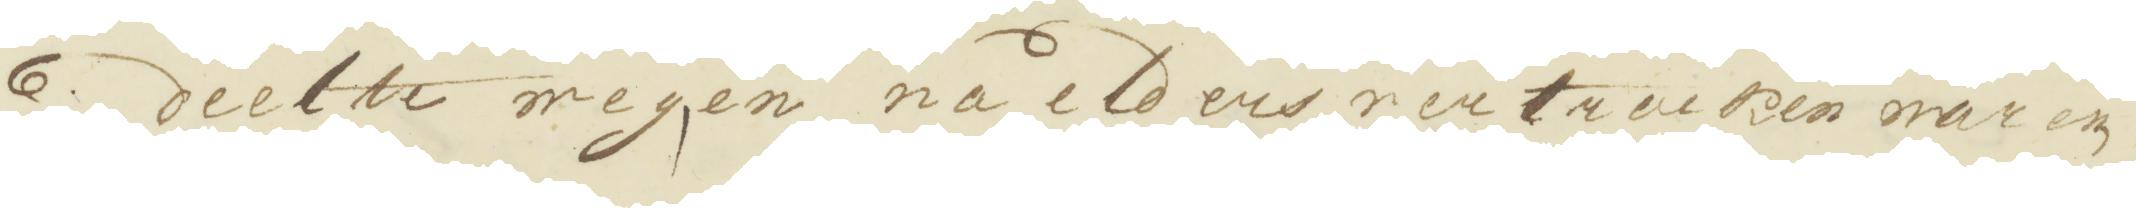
3 deelte wegen na elders vertrocken waren
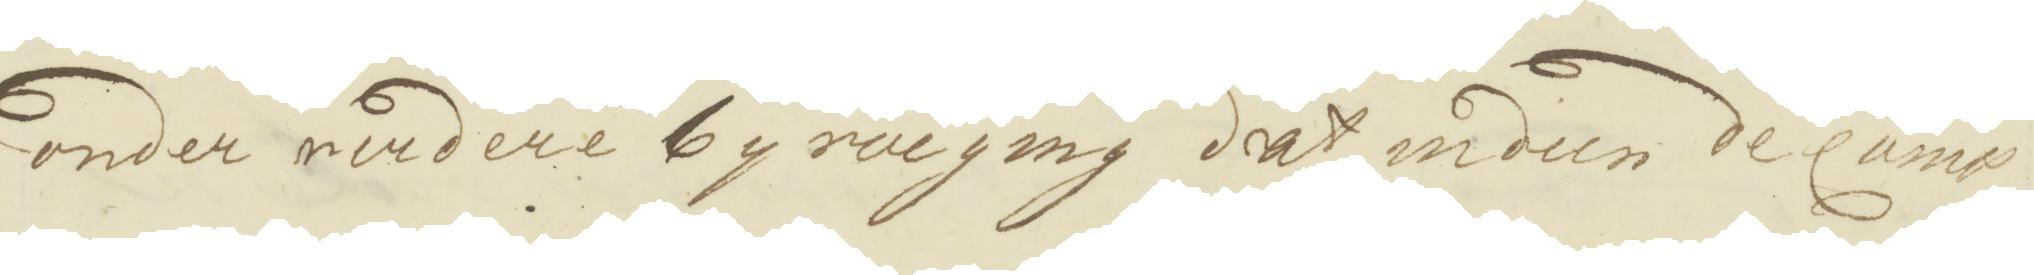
onder verdere by voeging dat indien de Comp
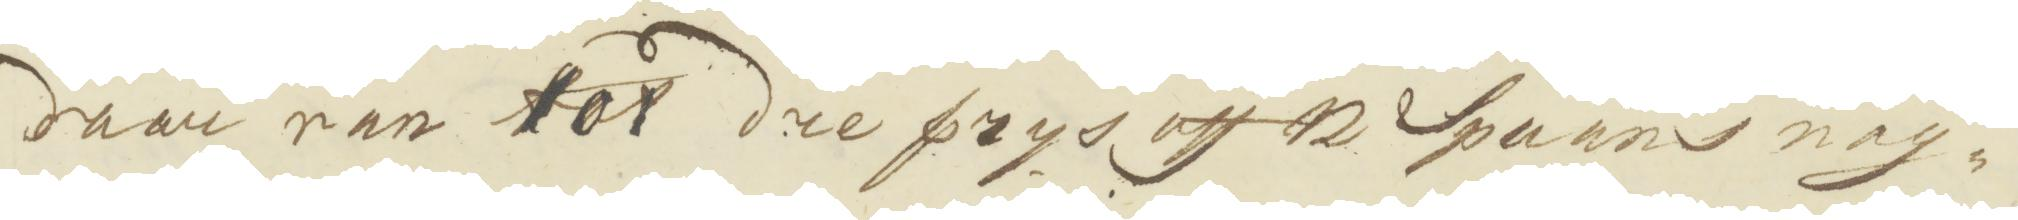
daar van tot die prys off 12 spaans nog„
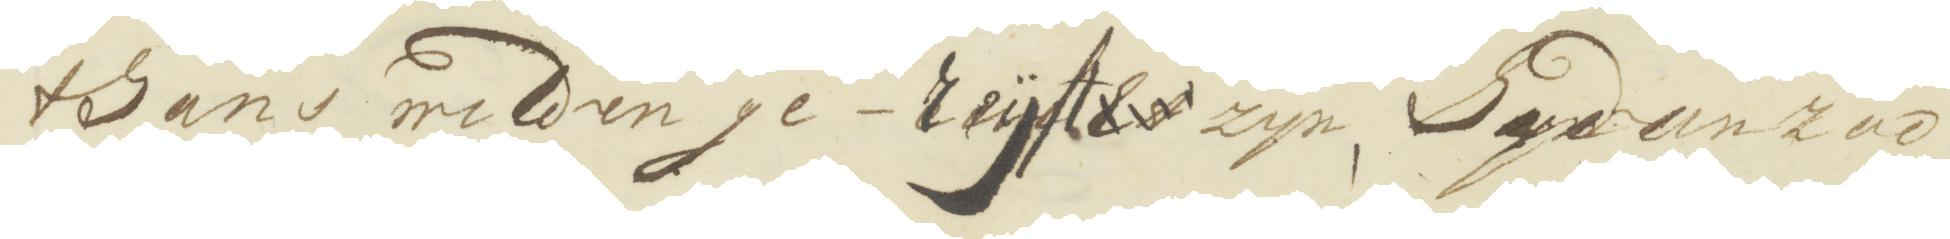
thans wilden ge-reijsths zijn, souden zoo
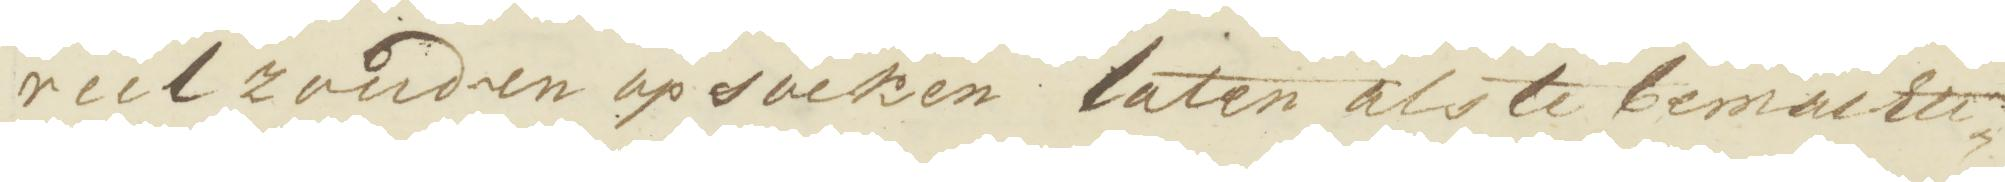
veel zouden opsoeken: laten als te bemachti„
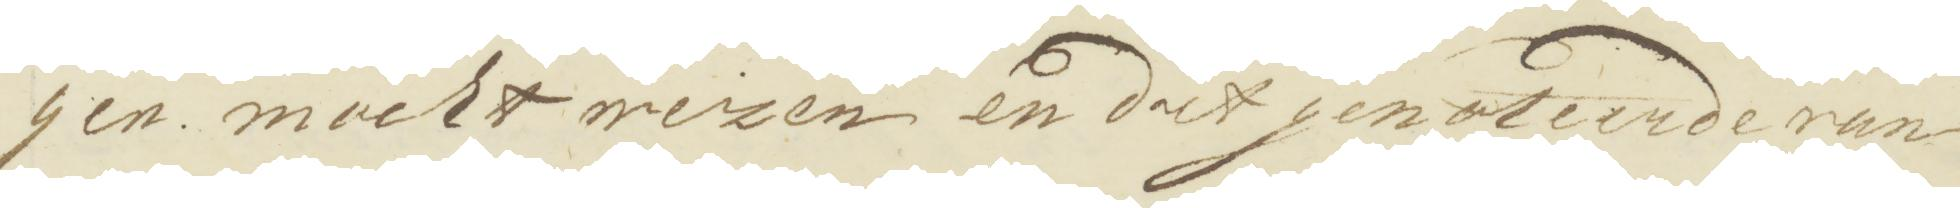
gen. moeht wezen en dat genoteerde van
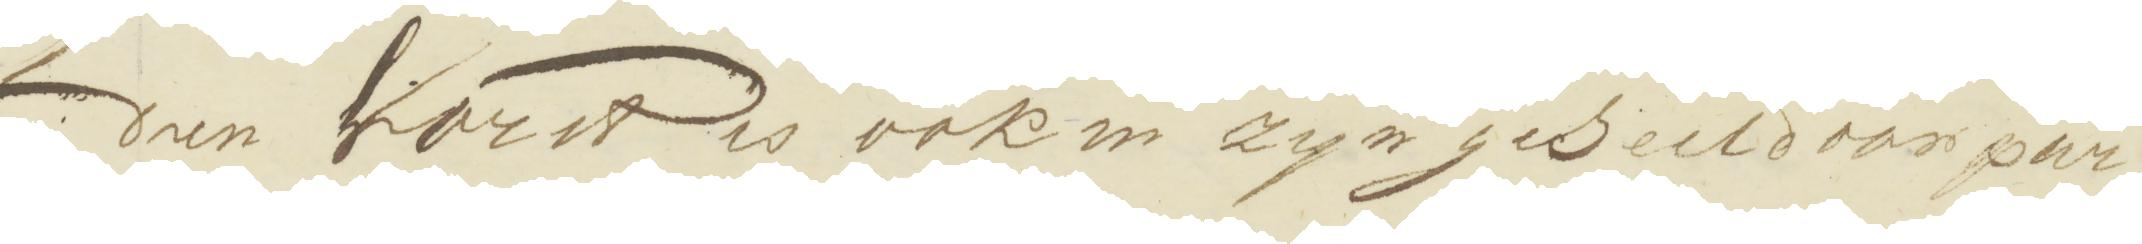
dien korst is ook in zyn geheel door par
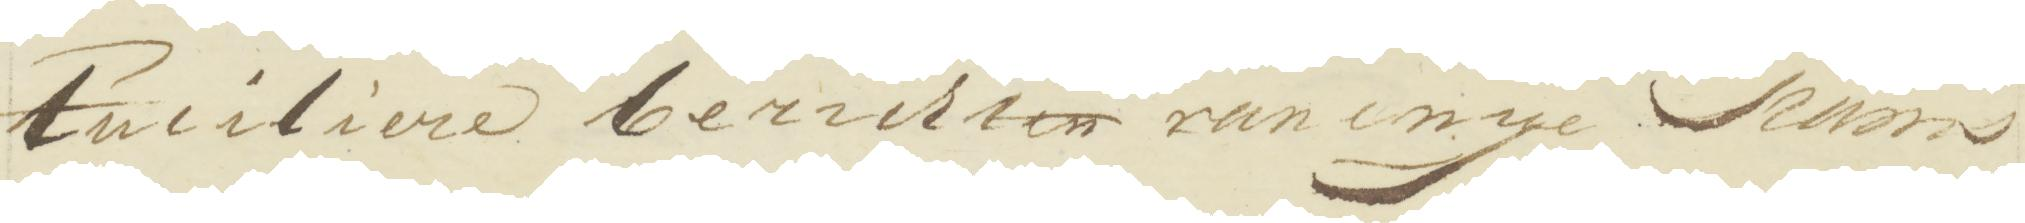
ticuliere berichten van enige Siams
